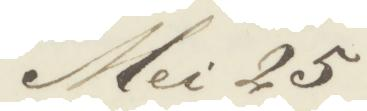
Mei 25
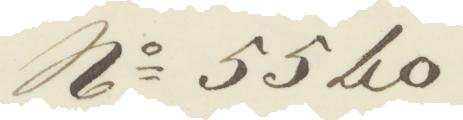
N=o 5540
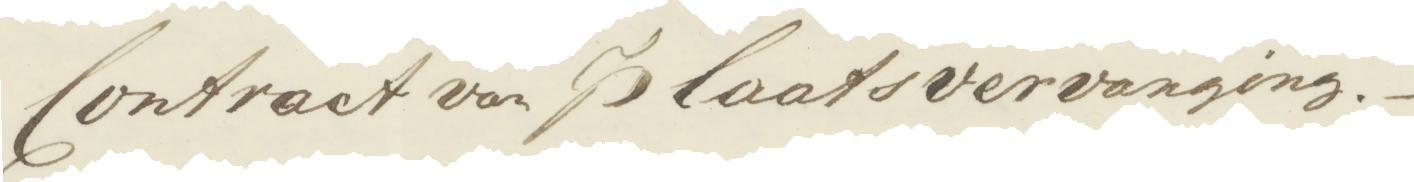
Contract van plaatsvervanging.-
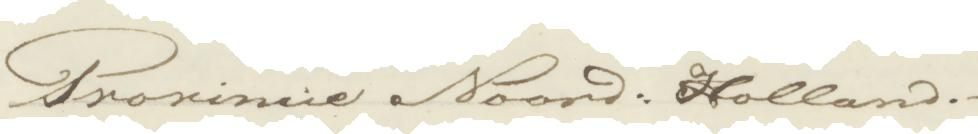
Provincie Noord: Holland.
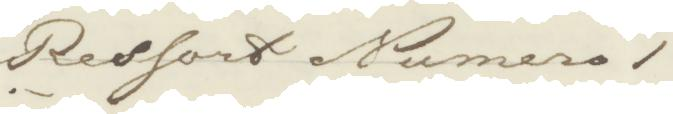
Ressort Numero 1
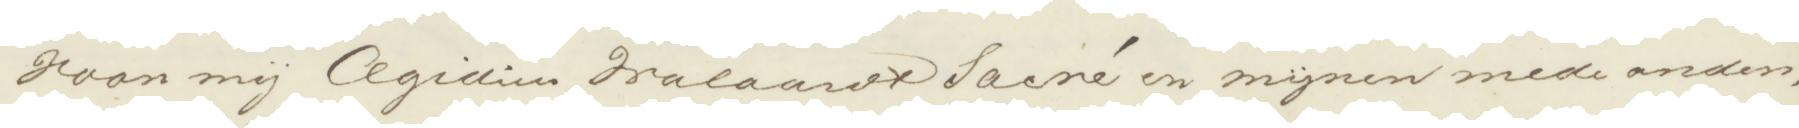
voor mij Aegidius Walaardt Sacré en mijnen mede onder
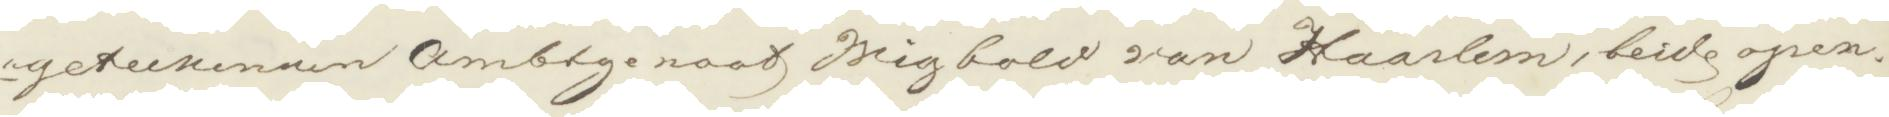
,geteekenden Ambtgenoot Wigbold van Haarlem, beide open
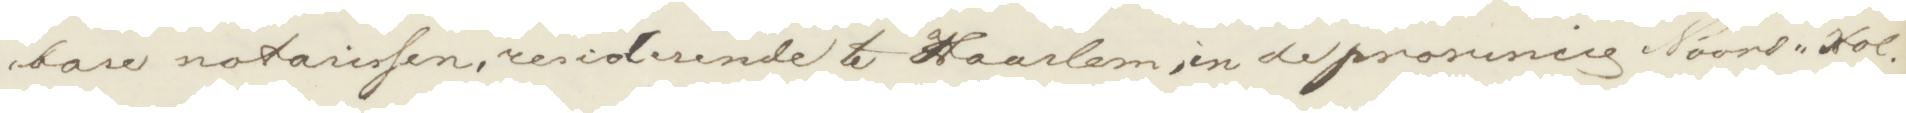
,bare notarissen, residerende te Haarlem, in de provincie Noord„Hol
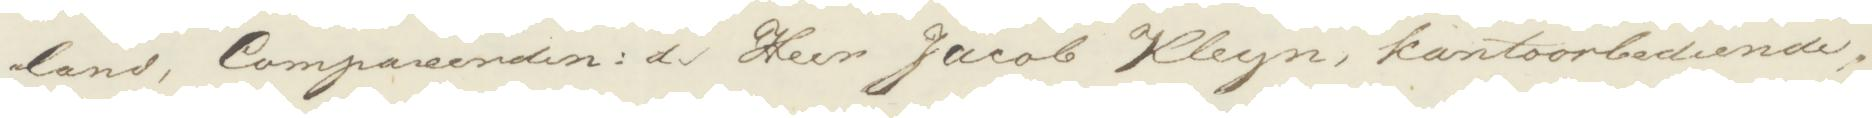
„land, Compareerden: de Heer Jacob Kleyn, kantoorbediende,
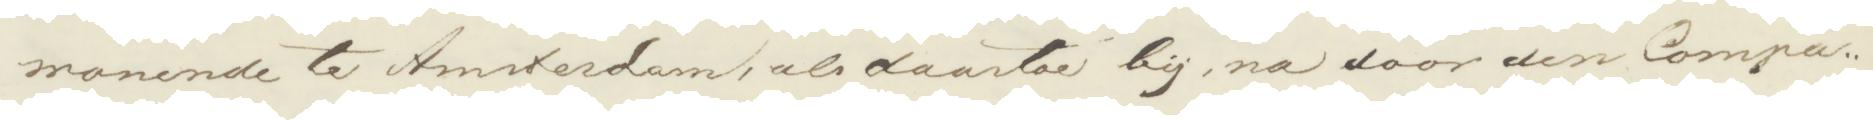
wonende te Amsterdam, als daartoe bij, na door den Compa„
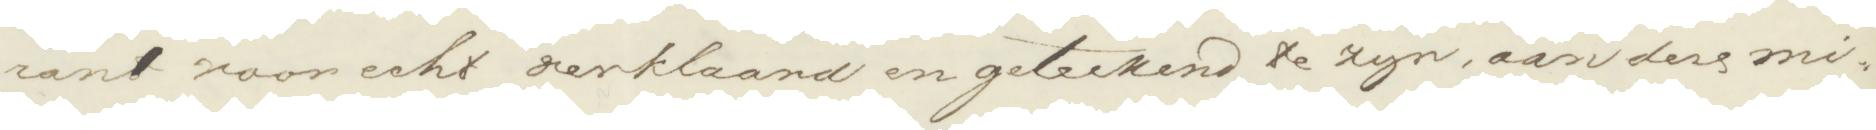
rant voor echt verklaard en geteekend te zyn, aan deze mi
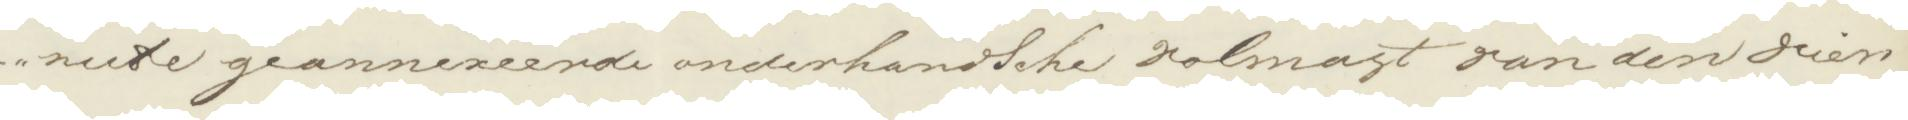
„nute geannexeerde onderhandsche volmagt van den vier
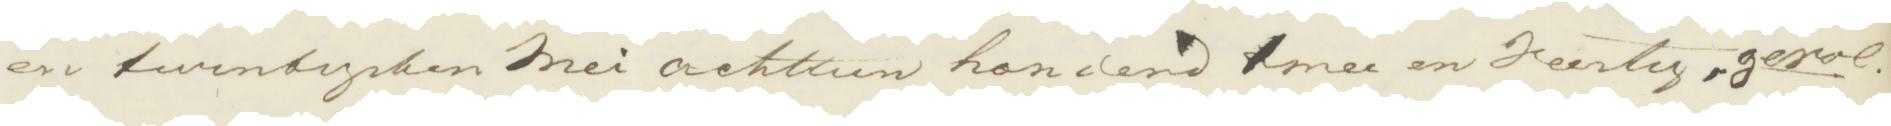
en twintigsten Mei achttien honderd twee en Veertig, gevol.
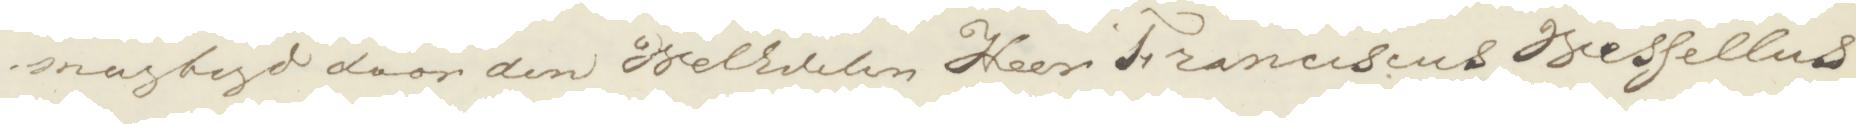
,magtigd door den WelEdelen Heer Franciscus Wessellus
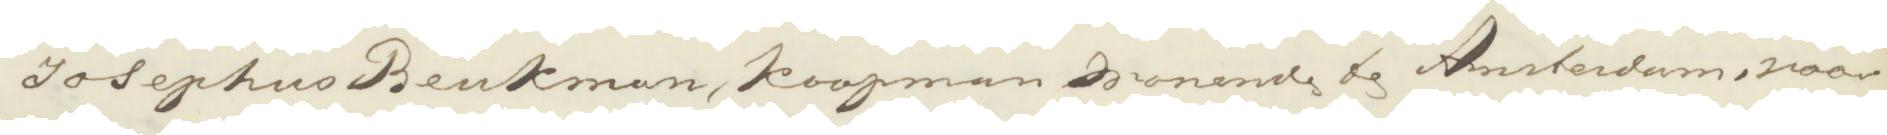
Iosephus Beukman, koopman wonende te Amsterdam, voor
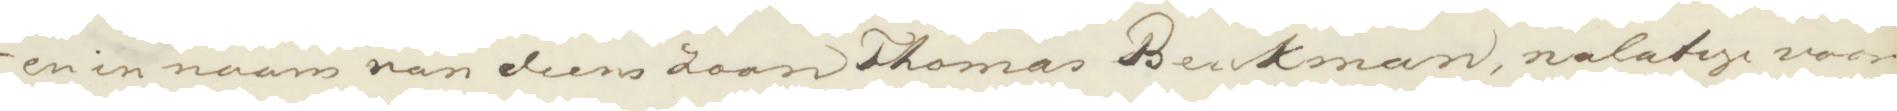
en in naam van diens zoon Thomas Beukman, nalatige voor
